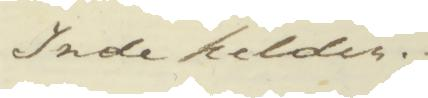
In de kelden.
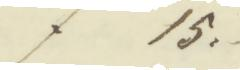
ƒ 15.
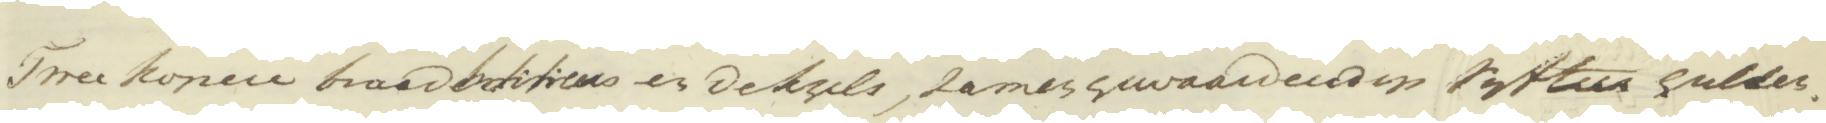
Twee kopere braadbekken en dekzels, zamen gewaardeerd op Vyftien gulden
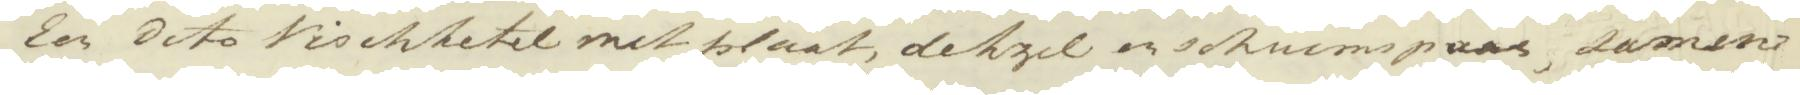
Een dito Vischhetel met plaat, dekzel en schuimspaan, zamen
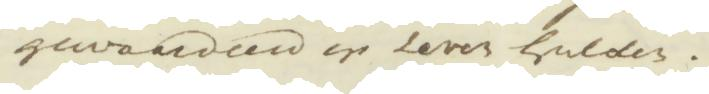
gewaardeerd op zeven Gulden.
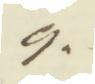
9„
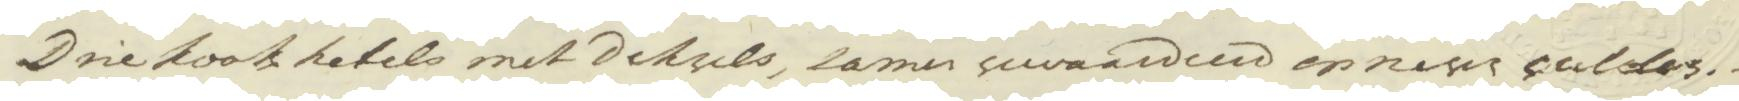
Drie kook ketels met dekzels, zamen gewaardeerd op negen gulden.
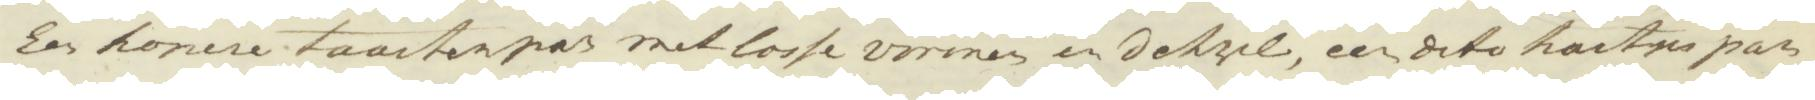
Een kopere taartenpan met losse vormen en dekzel, een dito hartjes pan
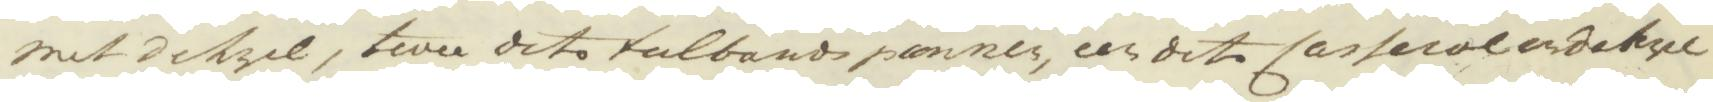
met dekzel, twee dito tulbands pannen, een dito Casserol en dekzel
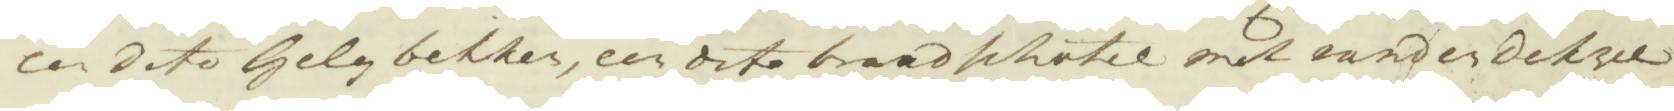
een dito Gely bekken, een dito braadschotel met aanden dekzel
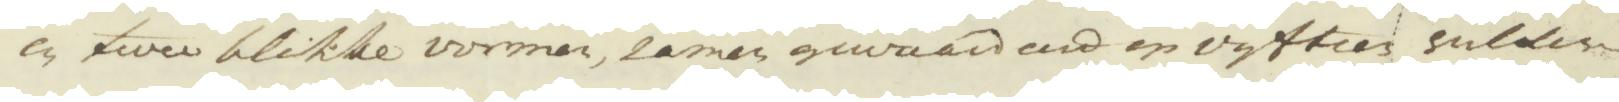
en twee blikke vormen, zamen gewaardeerd op vyftien gulden
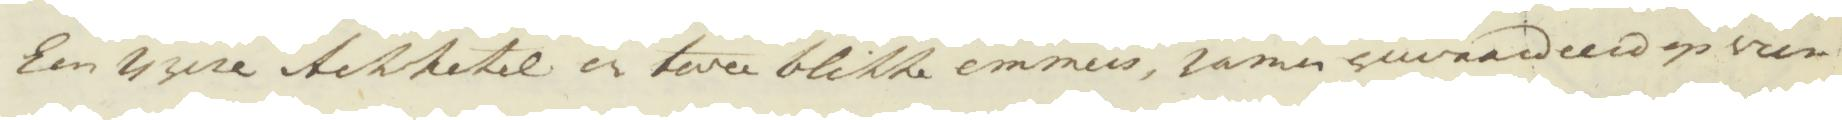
Een yzere tehketel en twee blikke emmers, zamen gewaardeerd op vier
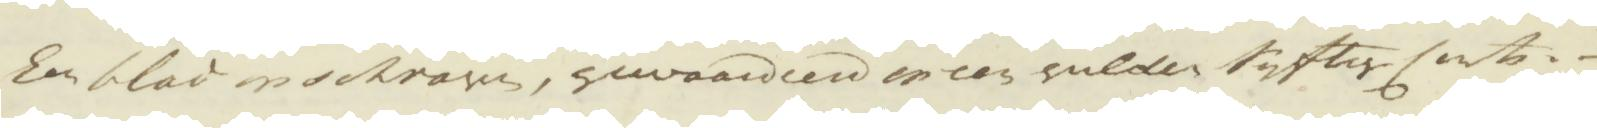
Een blad op schragen, gewaardeerd op een gulden Vyftig Cents.
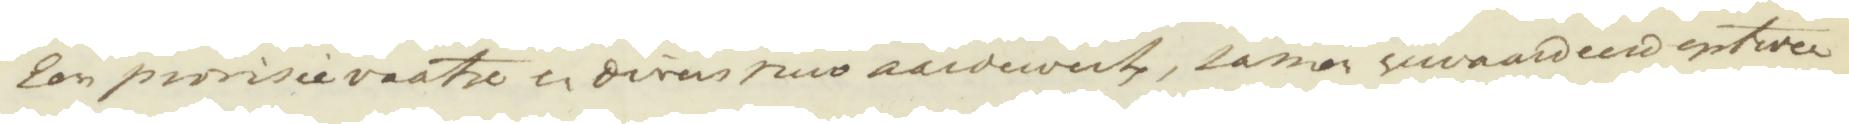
Een provisie vaatje en divers ruw aardewerk, zamen gewaardeerd op twee
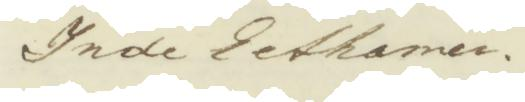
In de Eetkamer.
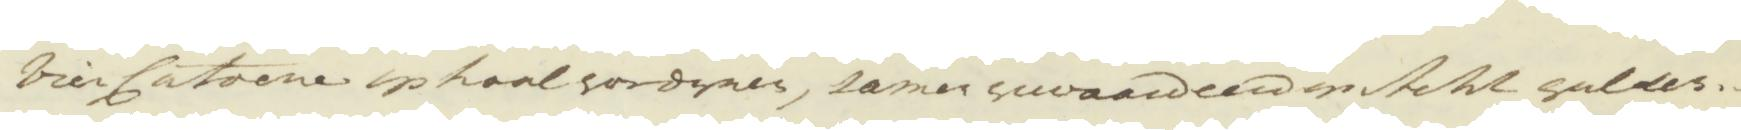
vier Catoene op haal gordynen, zamen gewaardeerd op Acht gulden.
